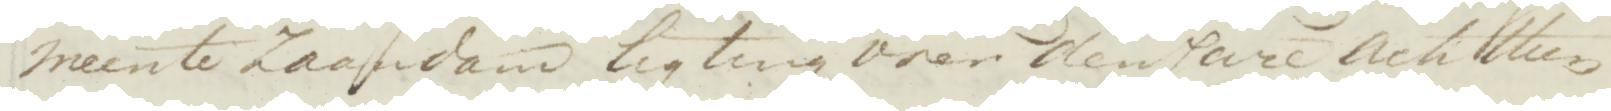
meente Zaandam ligting over den Jare achtttien
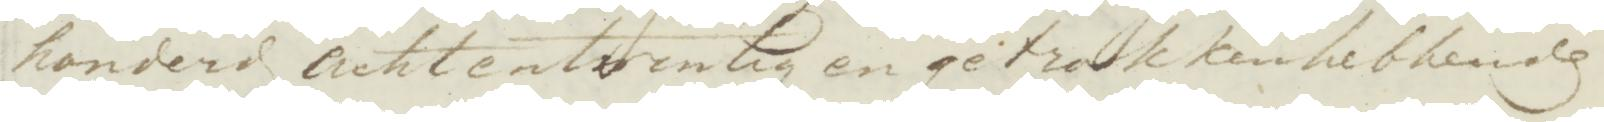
honderd achtentwintig en getrokken hebbende
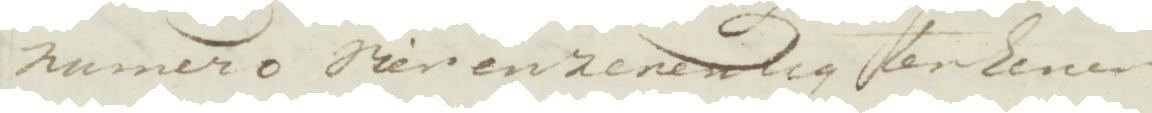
numero vier en zeventig ter Eenen
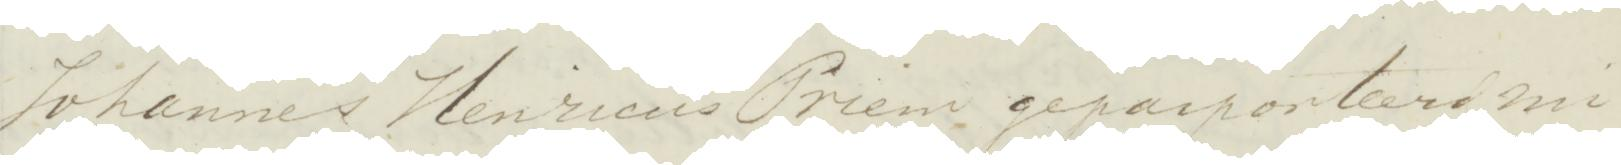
Johannes Henricus Priem gepasporteerd mi
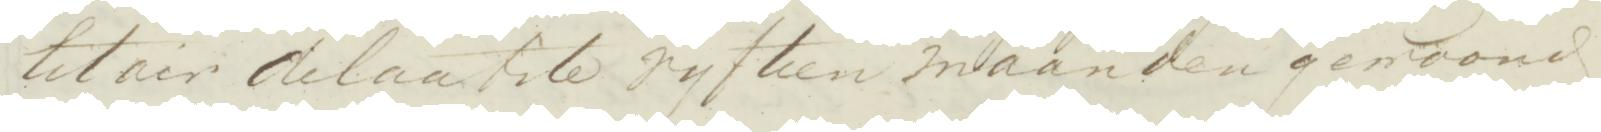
litair de laatste vyftien maanden gewoond
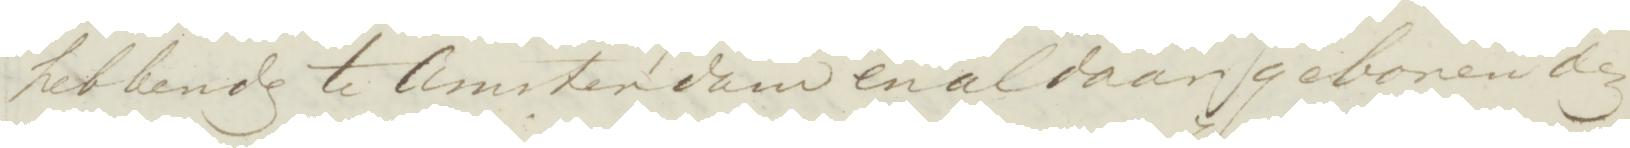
hebbende te Amsterdam en aldaar geboren den
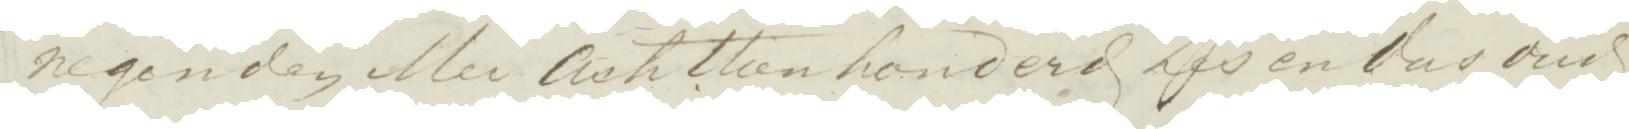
negenden Mei Achttienhonderd Zes en dus oud
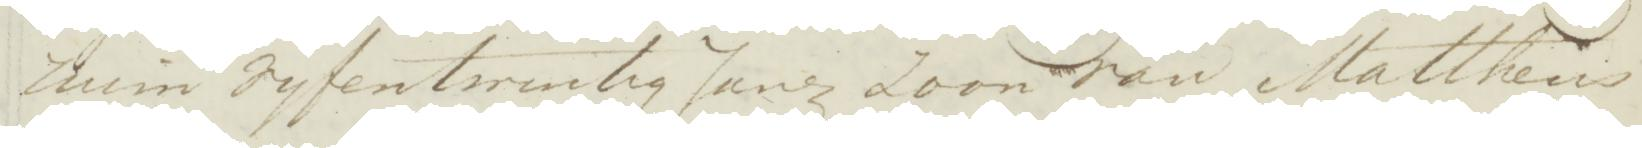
ruim vyfentwintig Jaren Zoon van Mattheus
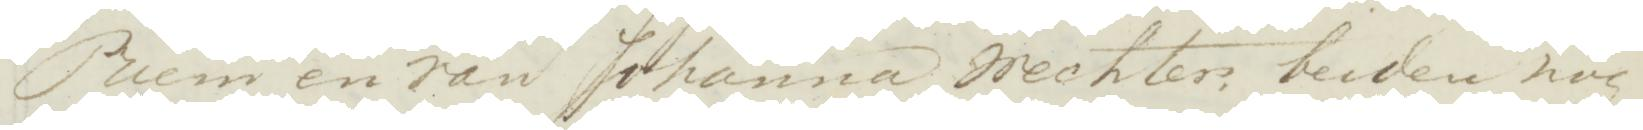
Priem en van Johanna Wechter, beiden nog
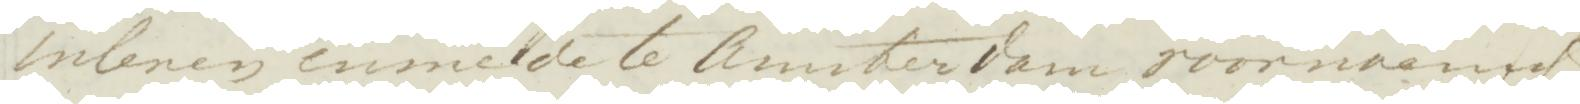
Inleven en mede te Amterdam voornoemd
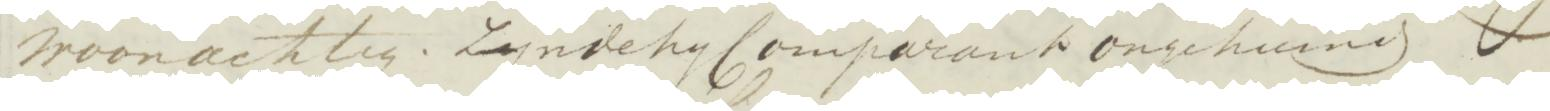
woonachtig. Zynde hy Comparant ongehuwd
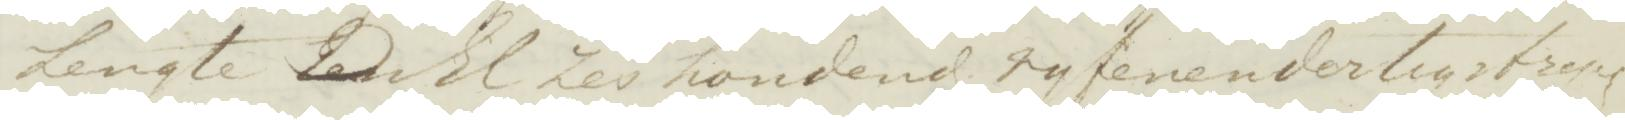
Lengte Een El zes honderd vyfenendertig strepen
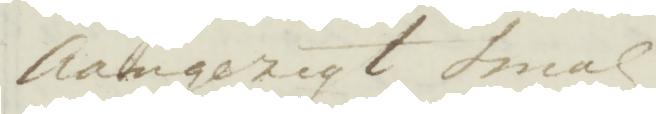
Aangezigt smal
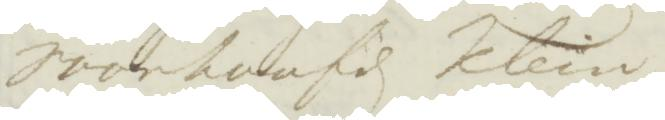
Voorhoofd klein
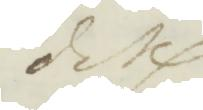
dik
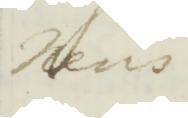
Neus
